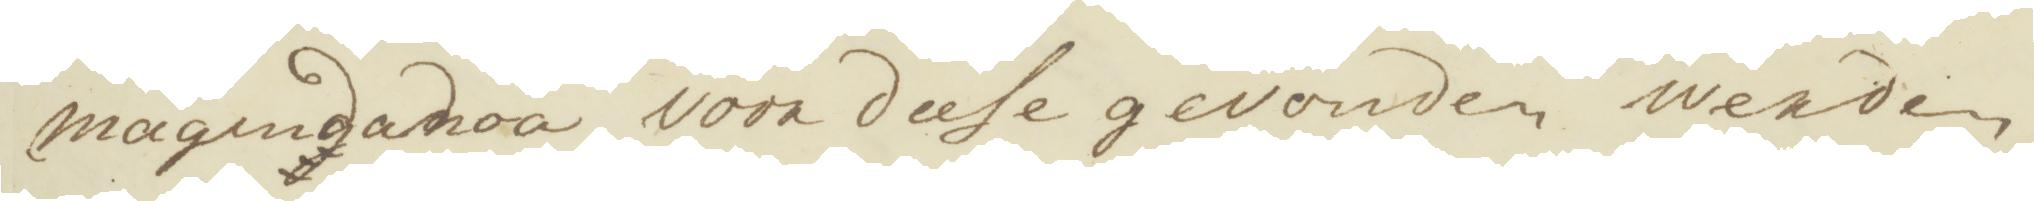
magindadroa voor deese gevonden werden
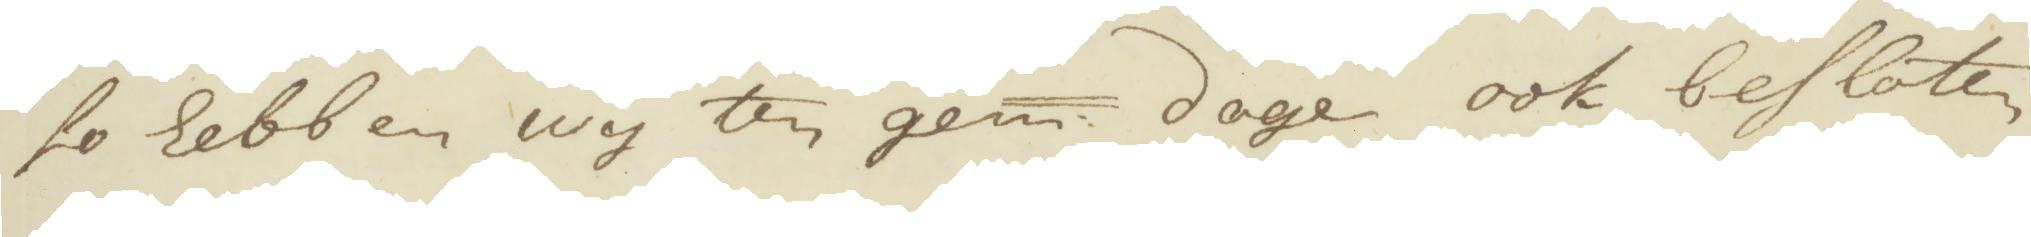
so hebben wij ten gem: dage ook besloten
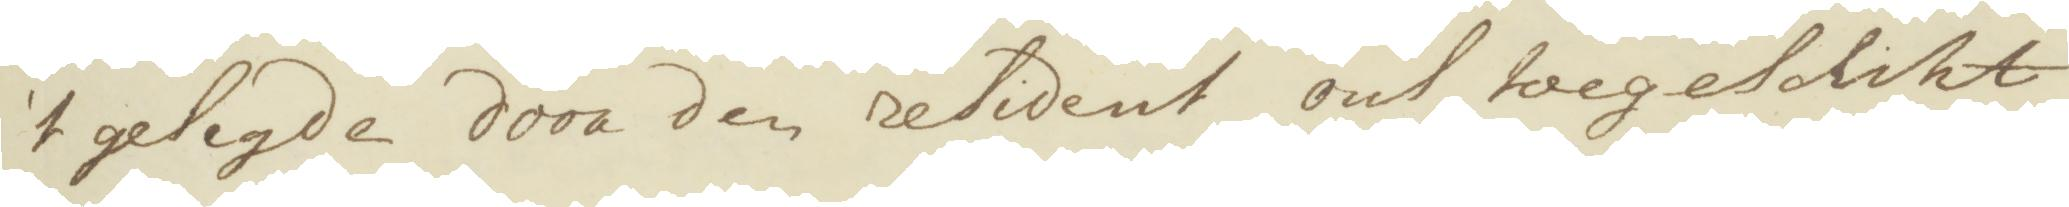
’t gesegde door den resident ons toegeschikt
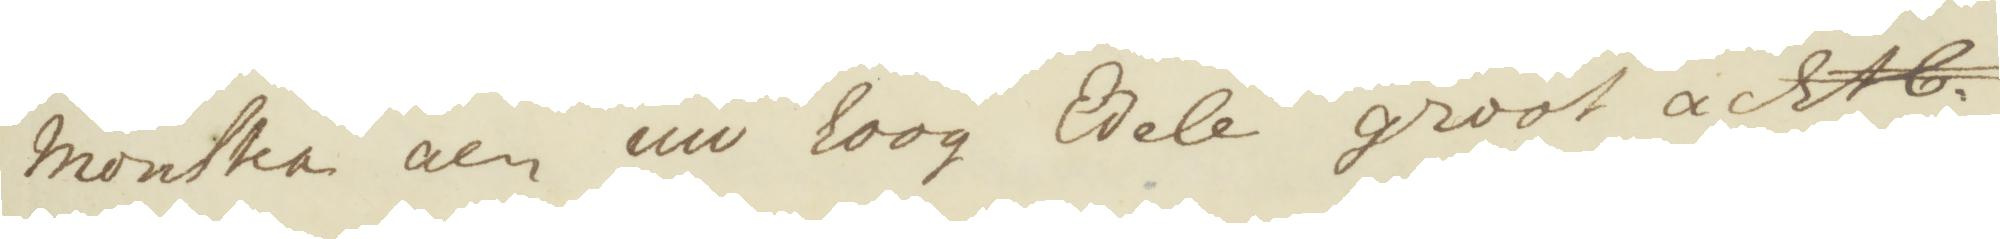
monster aen uw hoog Edele groot achtb.
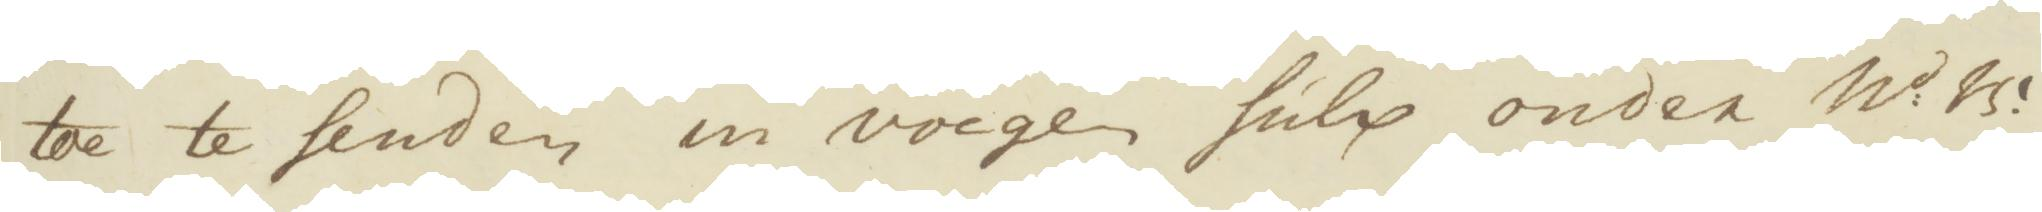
toe te senden in voegen sulx onder n:o 15.
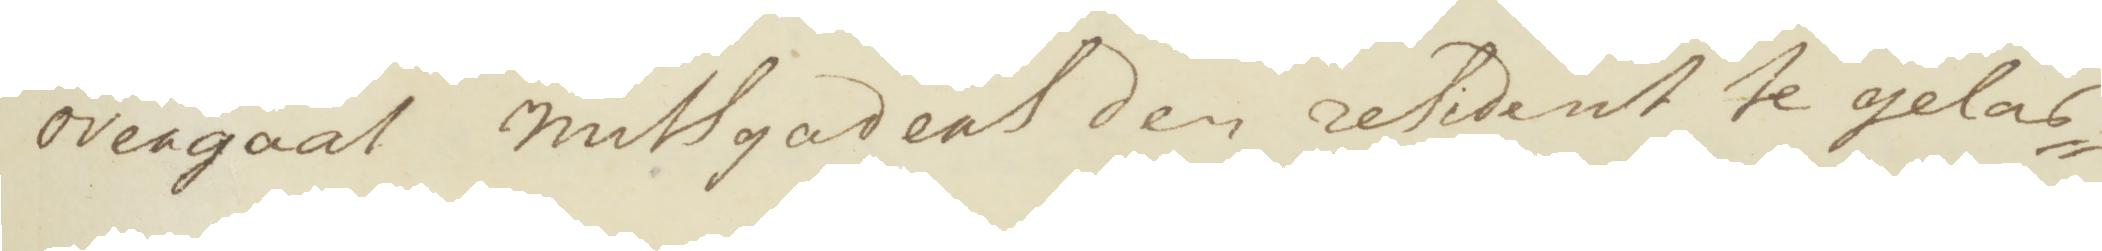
overgaat mitsgaders den resident te gelas=
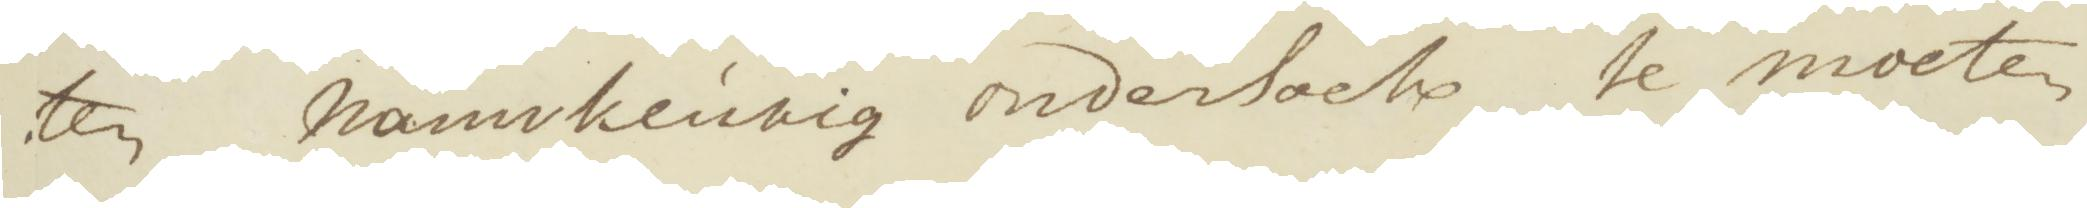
.ten nauwkeurig ondersoek te moeten
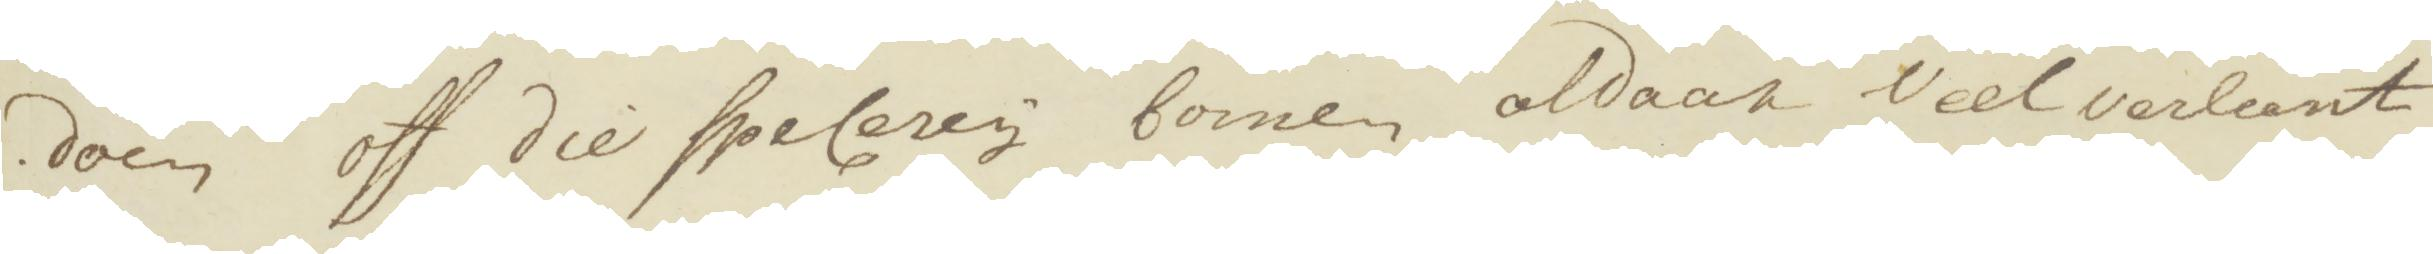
doen off die specereij bomen aldaar veel verleent
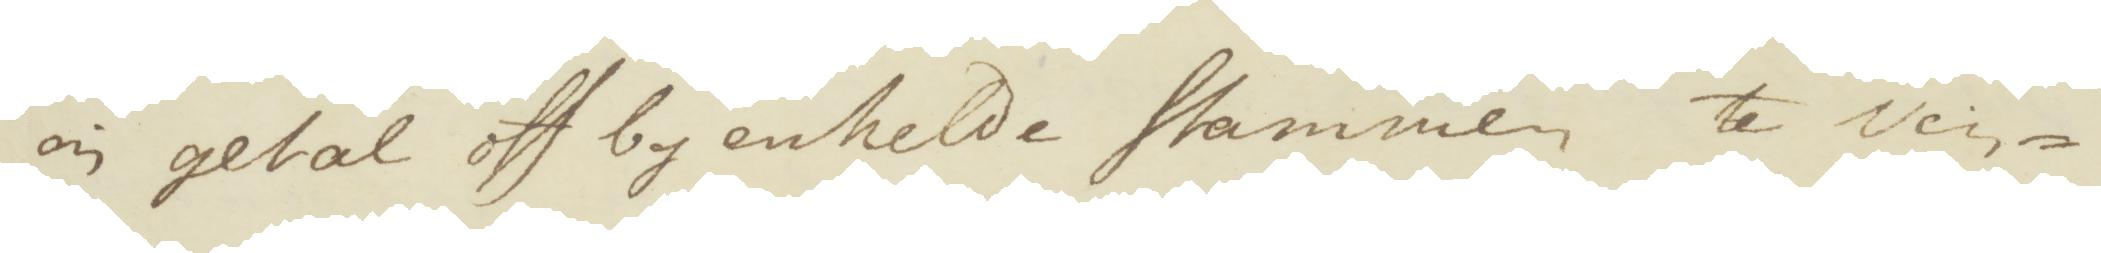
in getal off by enkelde stammen te vin=
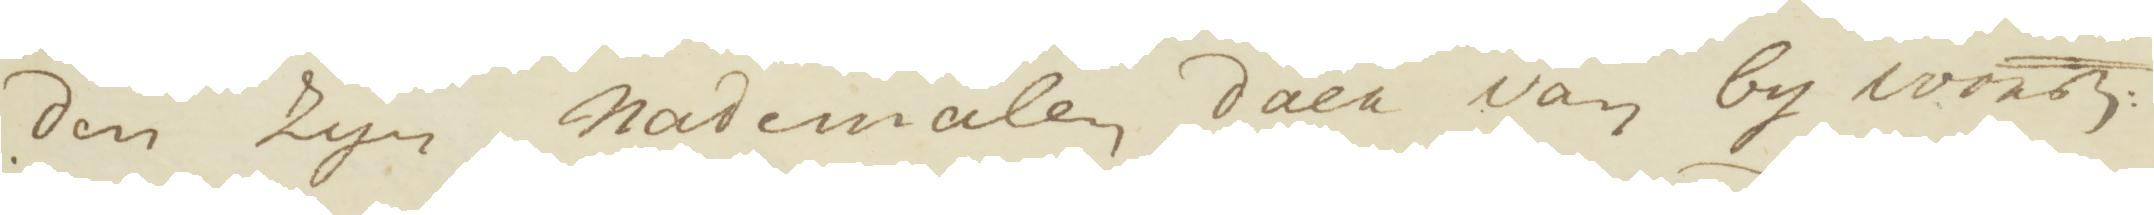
den zyn nademalen daer van bij voorsz:
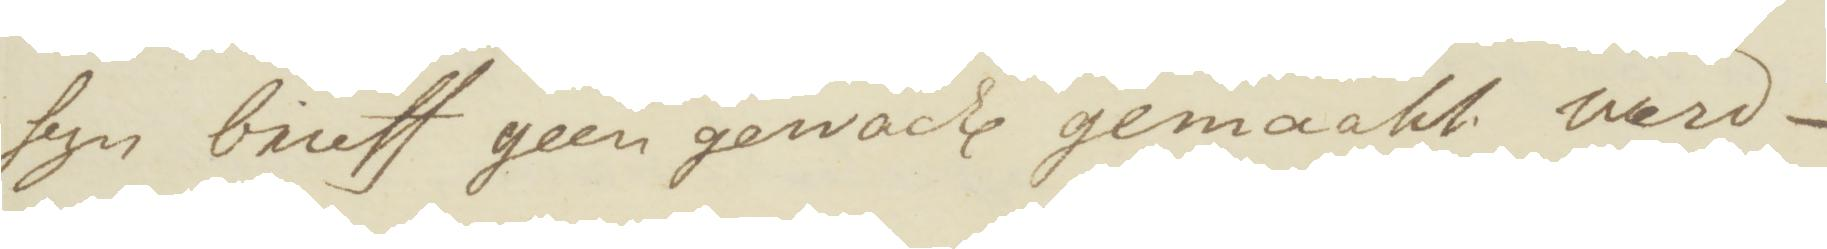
syn brieff geen gewach gemaakt werd
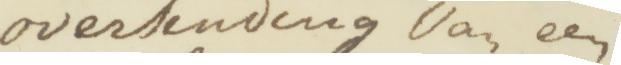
oversending van een
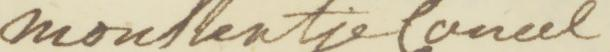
monstertje Caneel
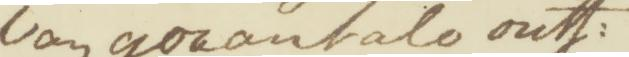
van gorantalo ontf:
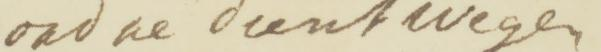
ordre dient wegen
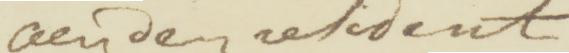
aen den resident
